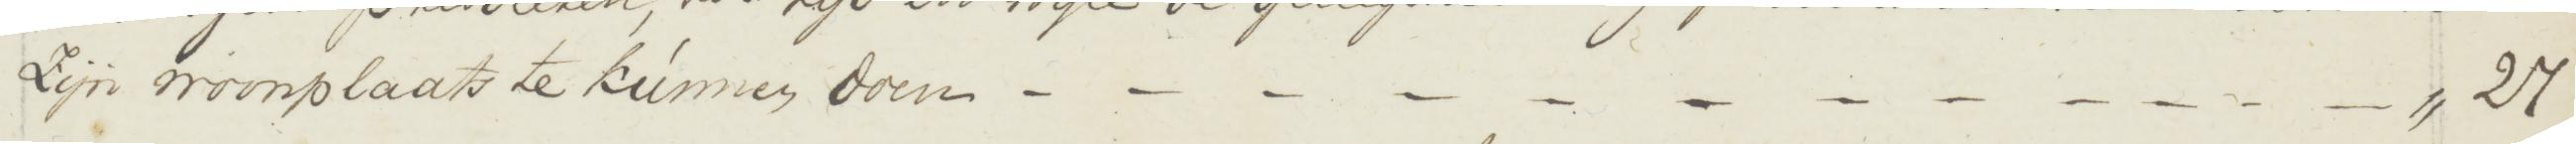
zijn woonplaats te kunnen doen - - - - - - - - - - - - „ 27
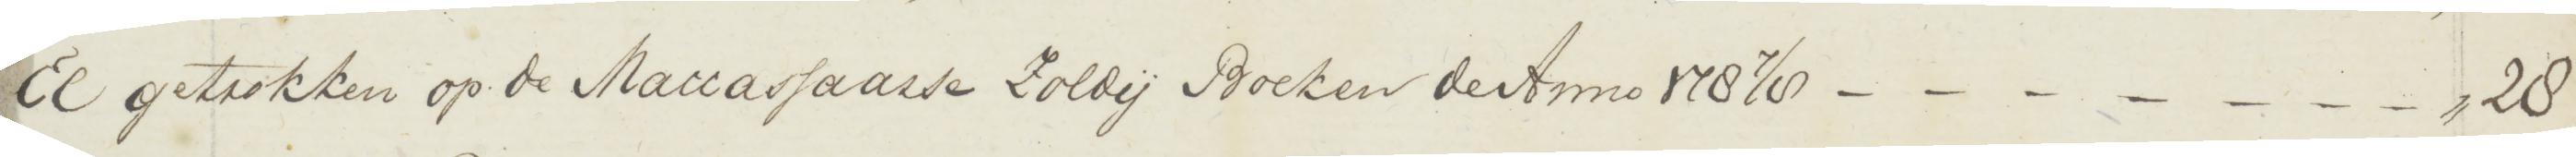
El getrokken op de Maccassaarse zoldij Boeken de Anno 1787/8 - - - - - - - „ 28
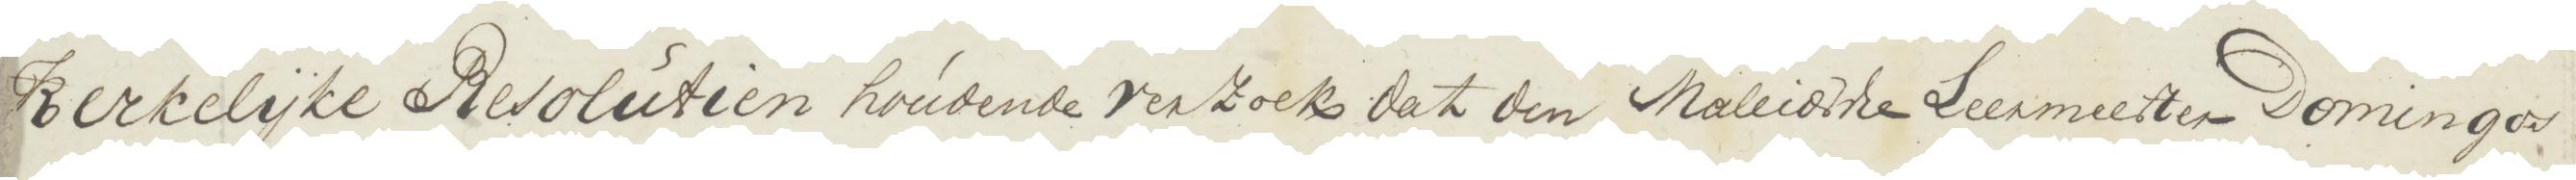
Kerkelijke Resolutien houdende verzoek dat den Maleidsche Leermeester Domingos
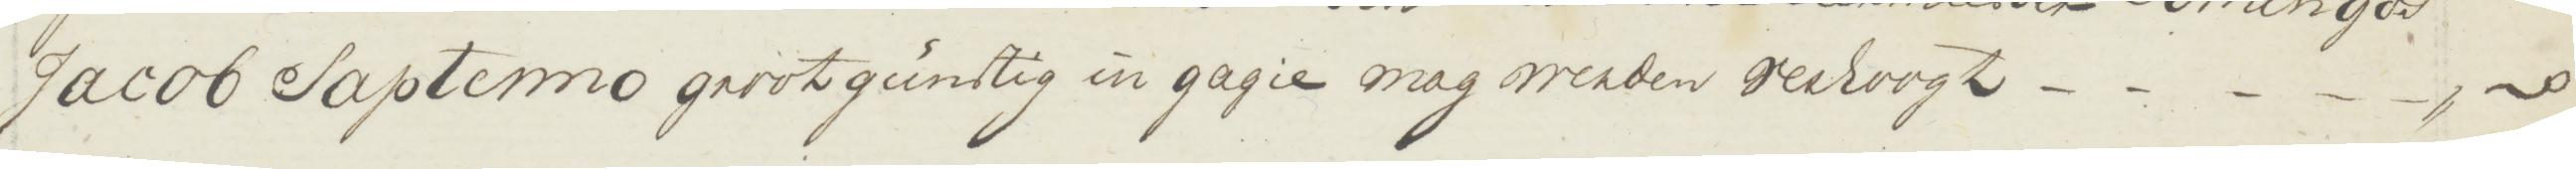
Jacob Saptenno grootgunstig in gagie mag werden verhoogt - - - - -„ _o
